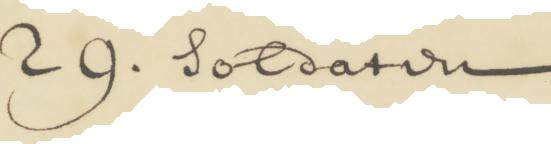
29. soldaten
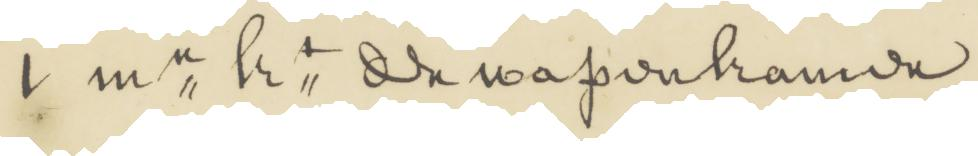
1 m„r k„t der wapenkamer
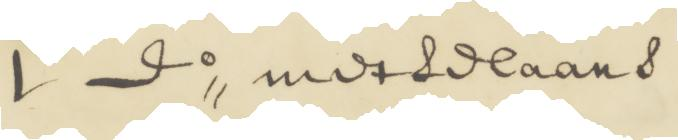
1 D„o metselaars
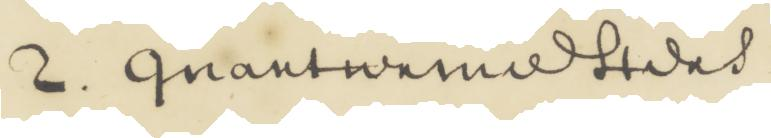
2. Quartiermeesters
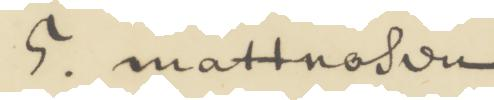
5. mattrosen
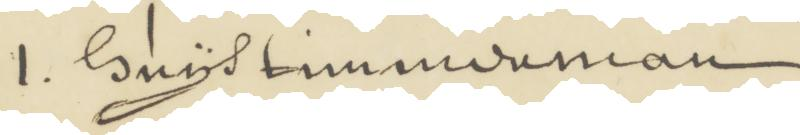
1. huijs timmerman
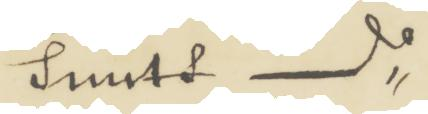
1 Smits D„o
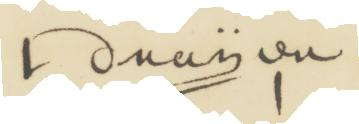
1 draijer
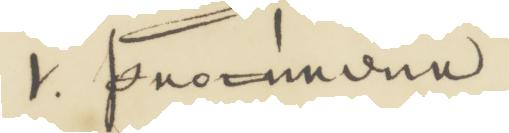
1. procureur
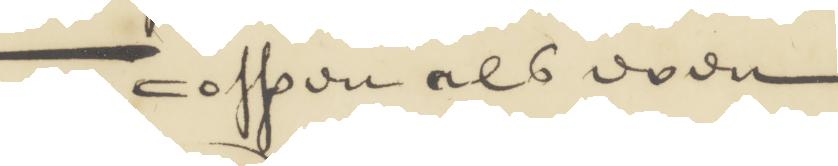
49 coppen als even
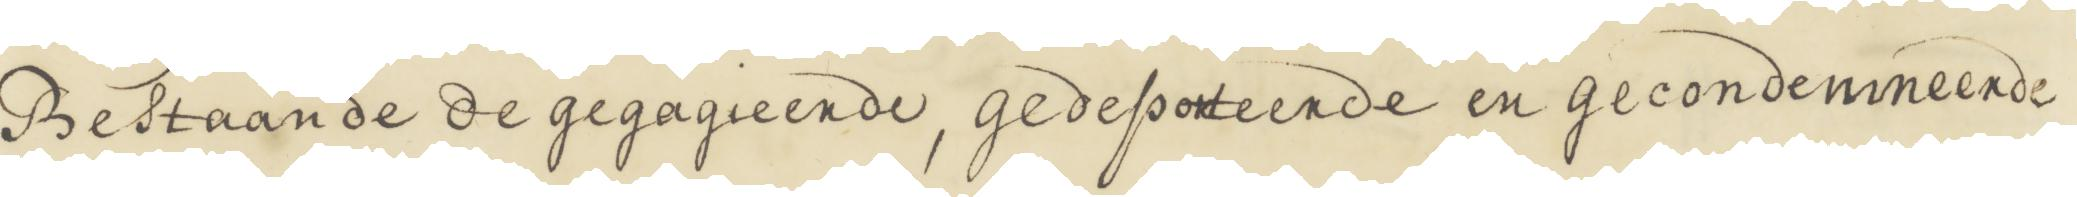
Bestaande de gegagieerde, gedeporteerde en gecondemneerde
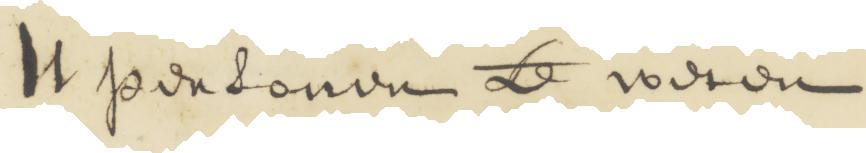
11 personen te weten
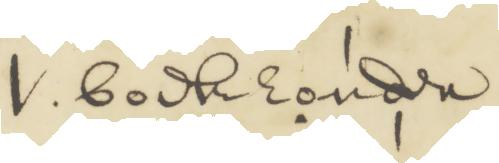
1. boekhouder
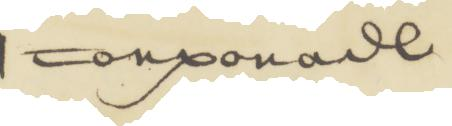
1 corporael
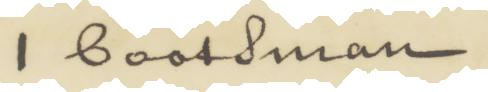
1 bootsman
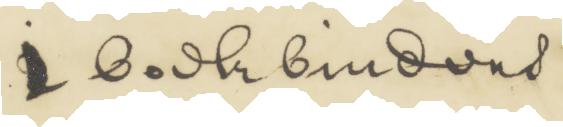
1 boekbinders
